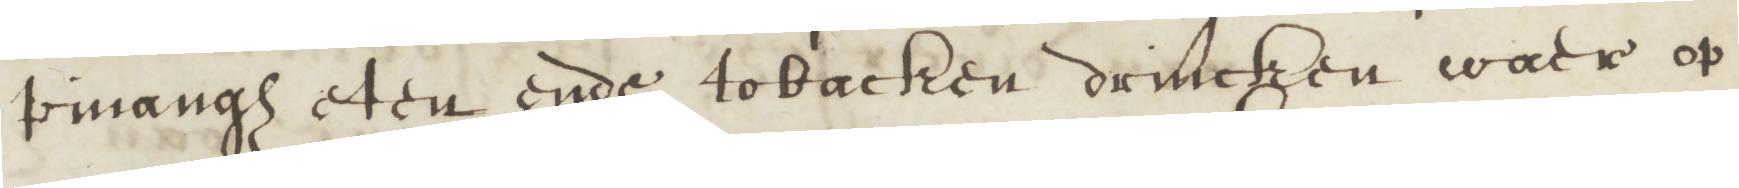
pinangh eten ende tobacken drincken waer op
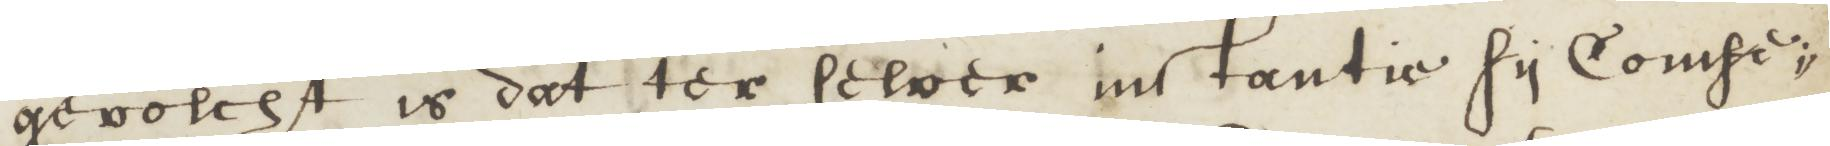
gevolcht is dat ter selver instantie sij Comfe;,
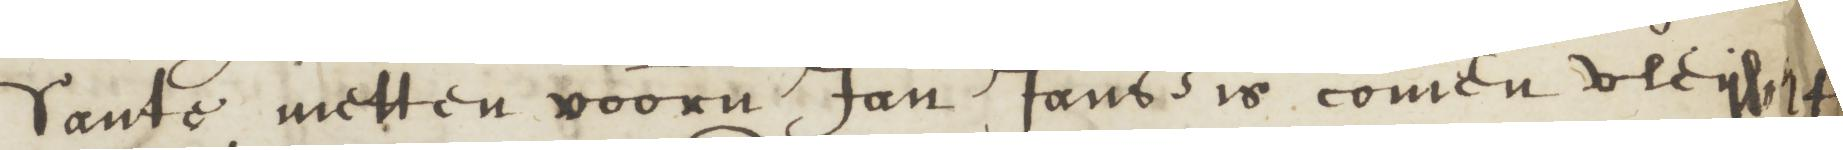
ssante metten voorn Jan Jansz is comen vleijs
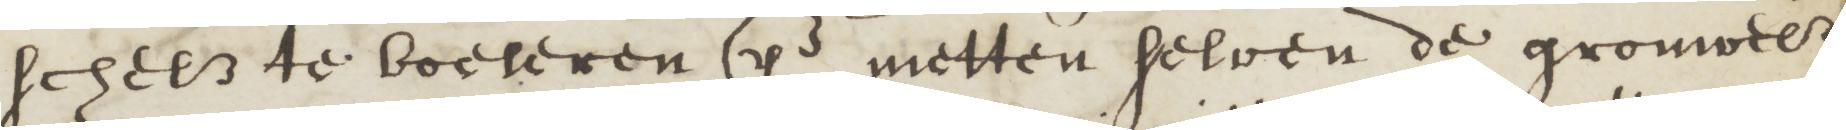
schelijk te boeteren ende metten selven de grouwelijk
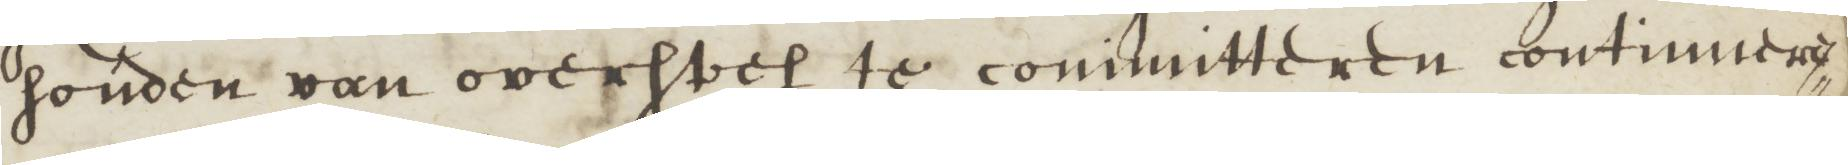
souden van overspel te committeren contiueren„
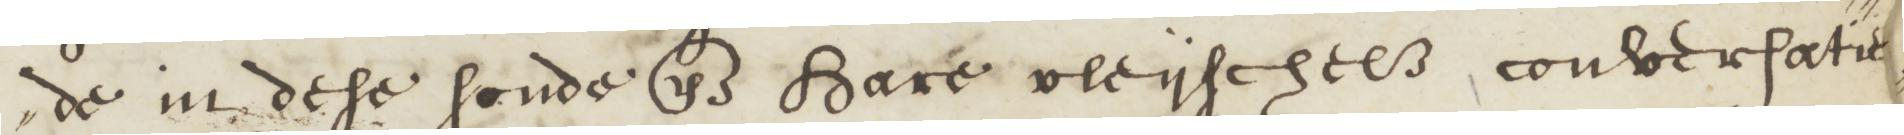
„de in dese soude ende hare vleijschelijk conversatie
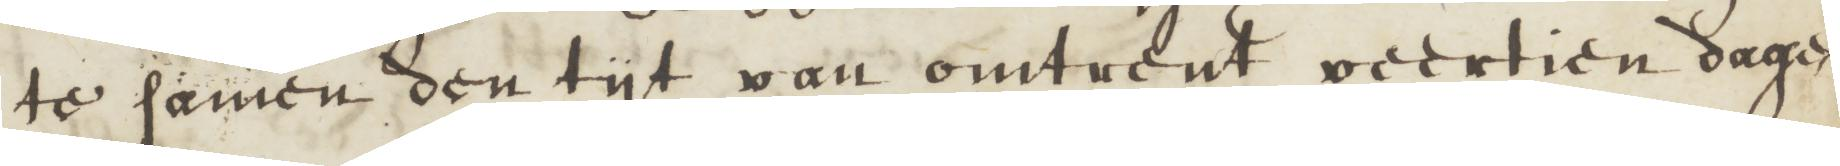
te samen den tijt van omtrent veertien dage,
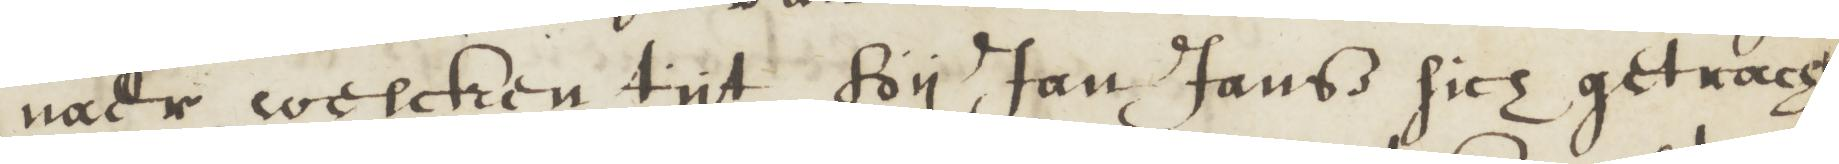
naer welcken tijt hij Jan Jansz sich getracht
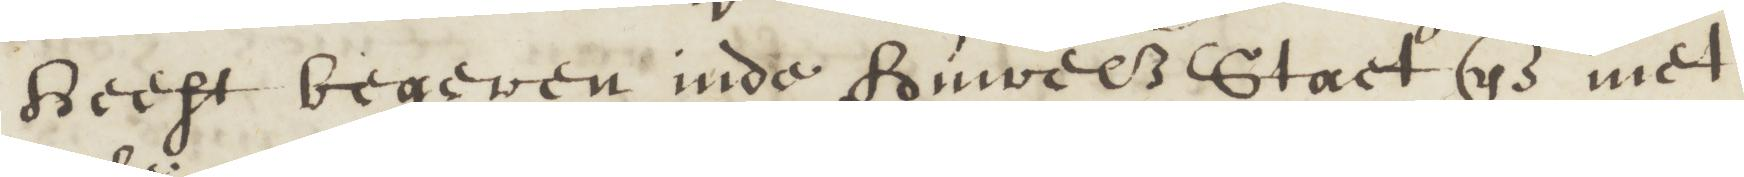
heeft begeven inde huwelijk staet ende met
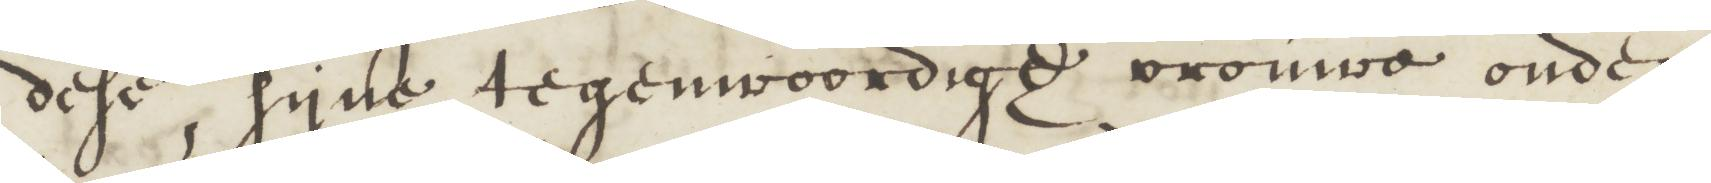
dese, sijne tegenwoordige vrouwe onder
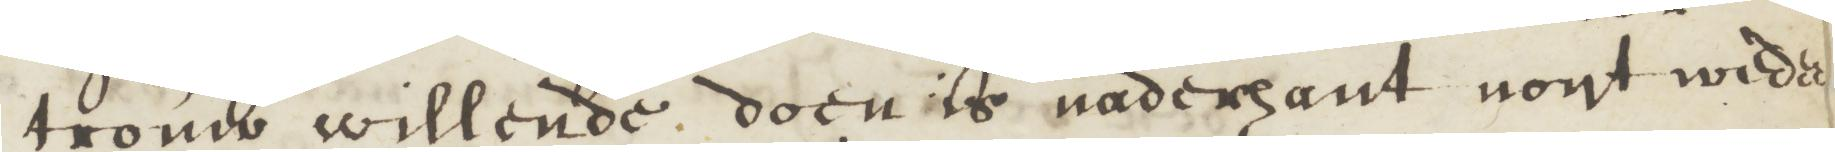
trouw willende doen is naderhant noyt weder
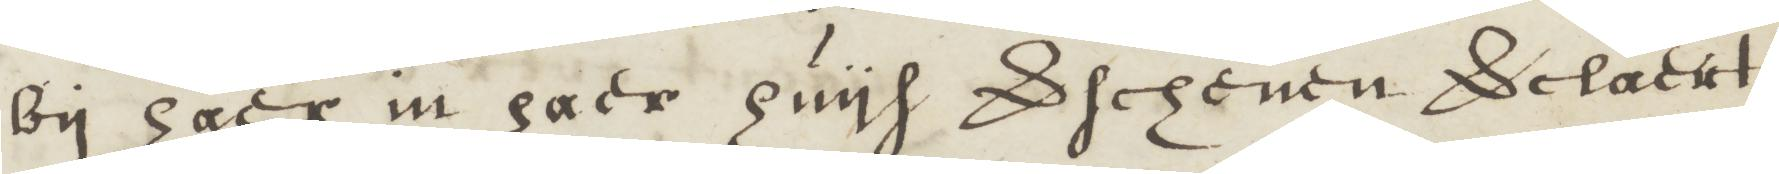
bij haer in haer huijs verschenen verclaert
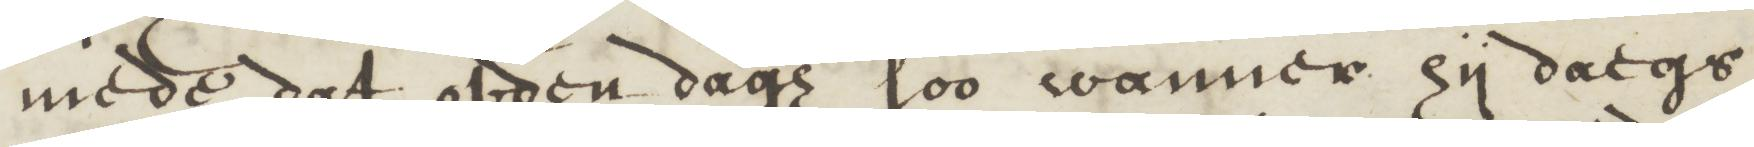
mede dat opden dagen soo wanner sij daegs
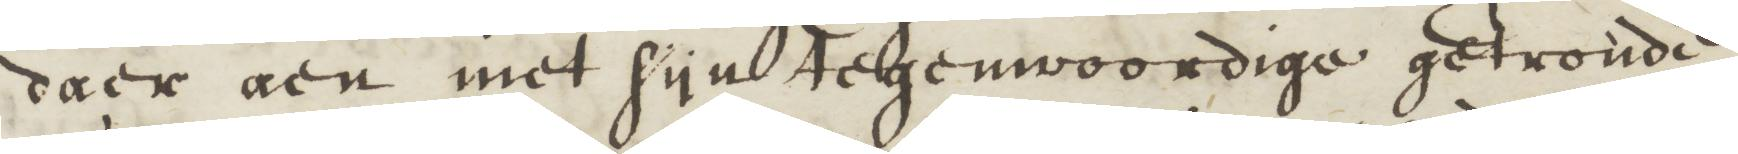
daer aen met sijn tegenwoordige getroude
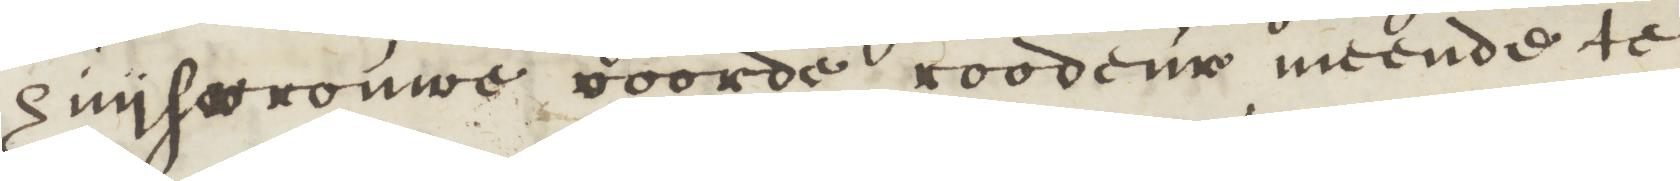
huijsvrouwe voorde roodeur meende te
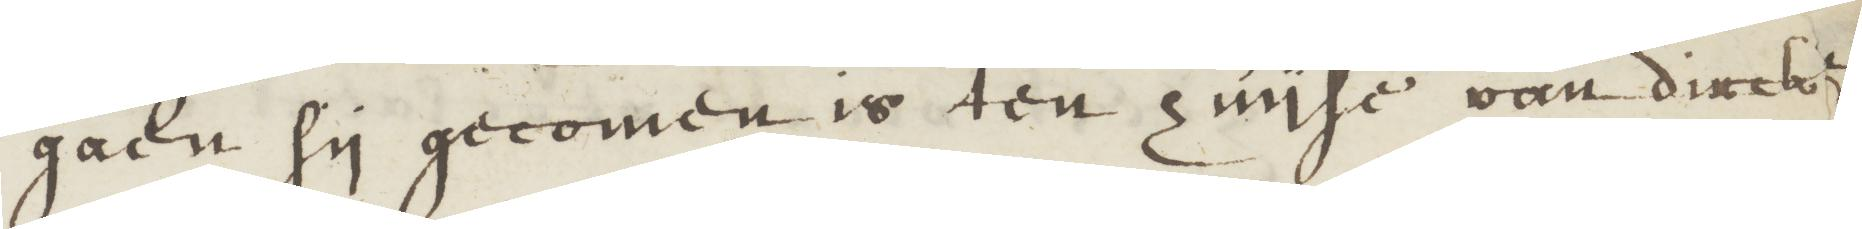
gaen sij gecomen is ten huijse van dirck
